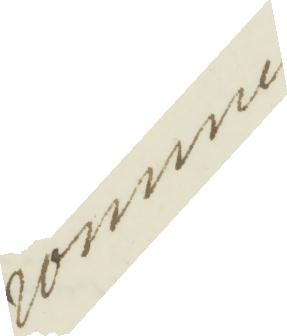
romme
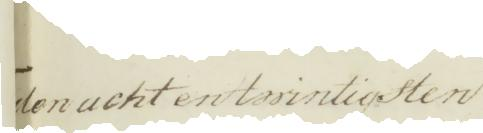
den achtentwintigsten
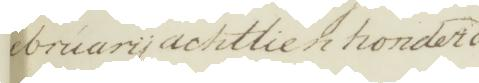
ebruarij achttien honderd
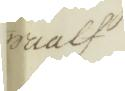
waalf
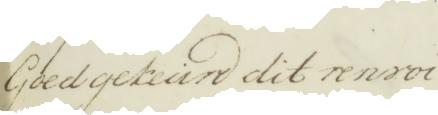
Goedgekeurd dit renvoi
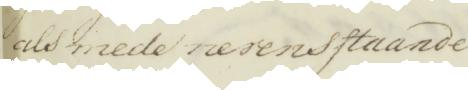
als mede nevensstaande
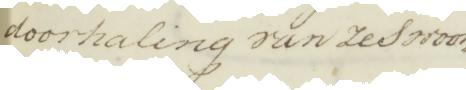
doorhaling van zes woor
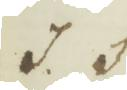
J. S
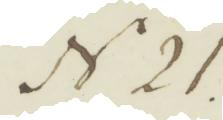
N 21.
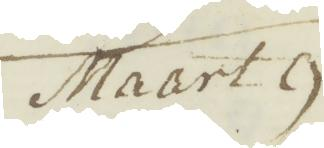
Maart 9
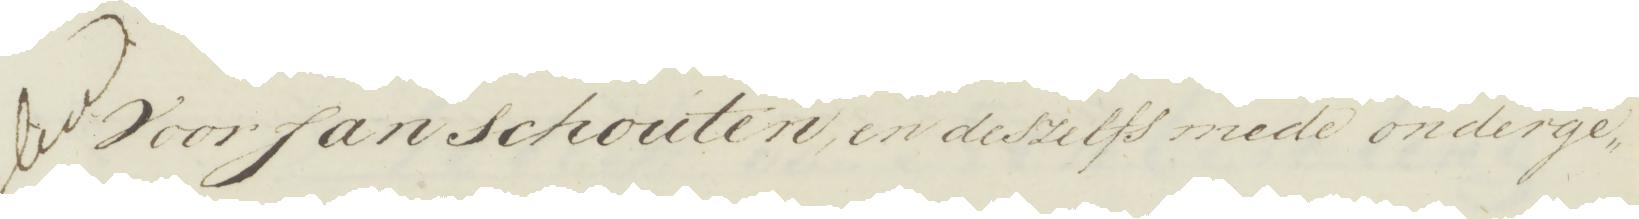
Voor Jan Schouten, en deszelfs mede onderge„
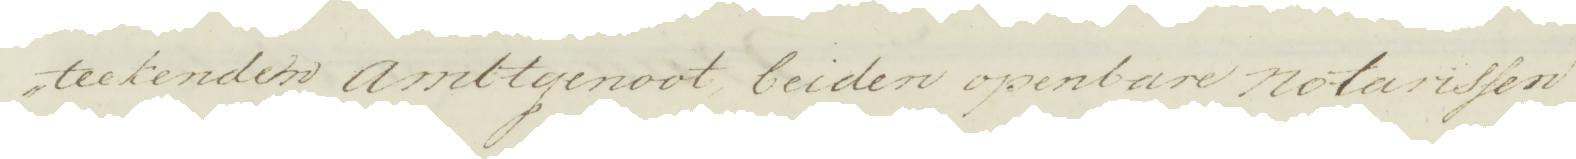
„teekenden Ambtgenoot beiden openbare notarissen
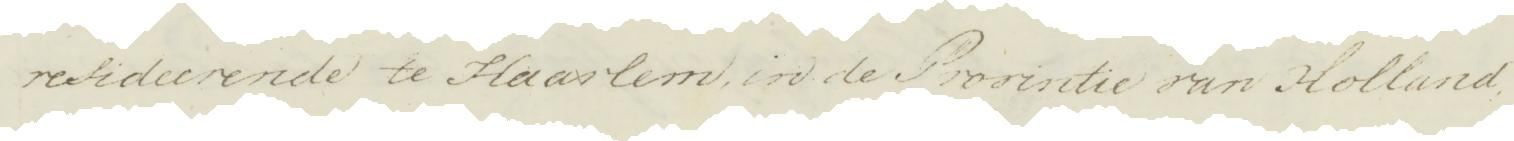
resideerende te Haarlem, in de Provintie van Holland,
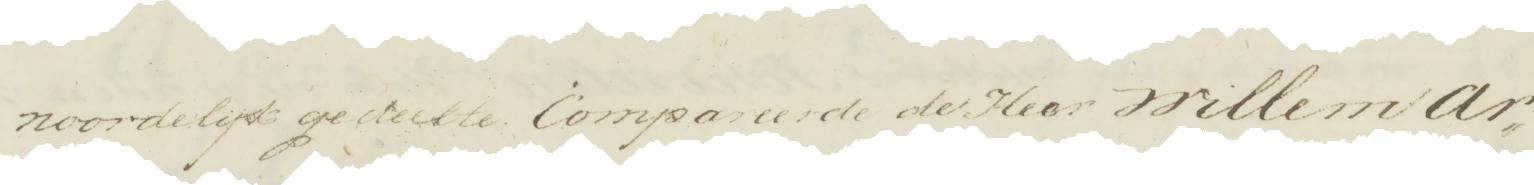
noordelijk gedeelte Compareerde de Heer Willem Ar„
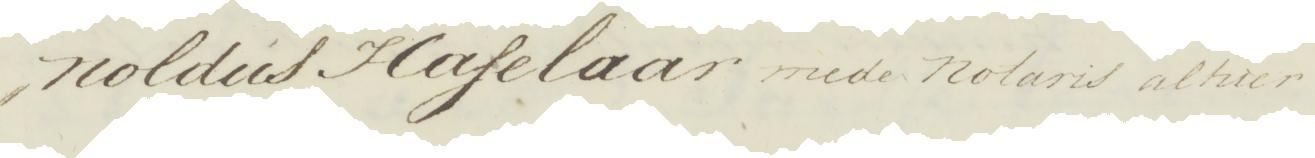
„noldus Haselaar mede Notaris alhier
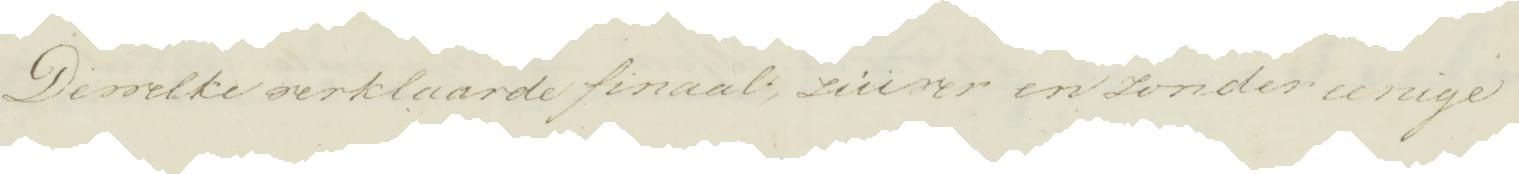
Dewelke verklaarde finaal, zuiver en zonder eenige
